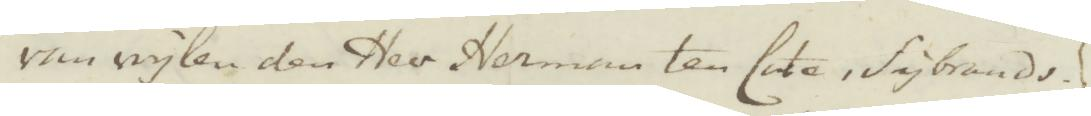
van wijlen den Heer Herman ten Cate, Sijbrands.
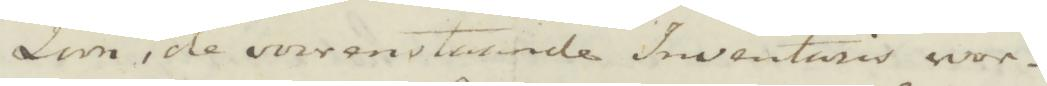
Zoon, de voorenstaande Inventaris wor-
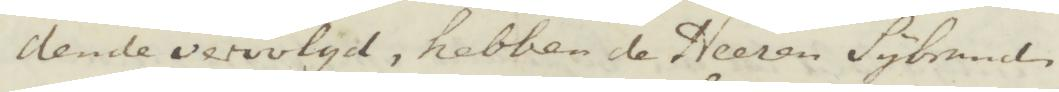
dende vervolgd, hebben de Heeren Sijbrands
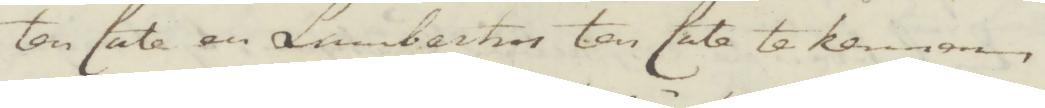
ten Cate en Lambertus ten Cate te kennen
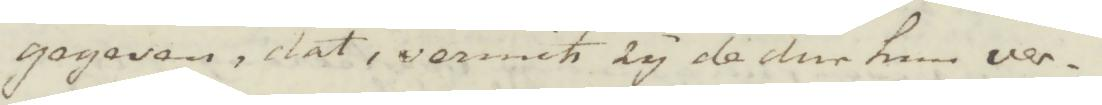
gegeven, dat, vermits zij de door hen ver„
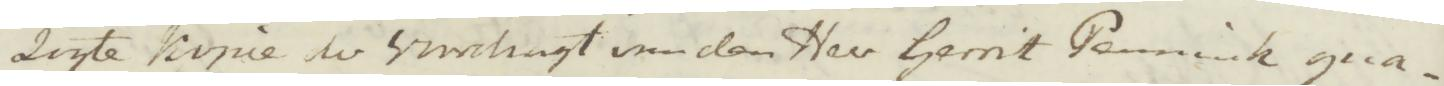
zogte kopie der voordragt van den Heer Gerrit Pennink qua=
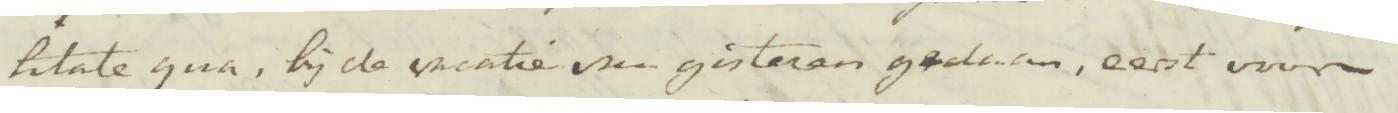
litate qua, bij de vacatie van gisteren gedaan, eerst voor
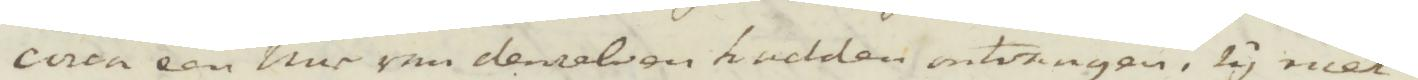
circa een uur van denzelven hadden ontvangen, zij niet
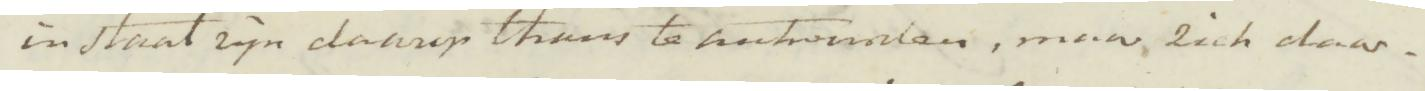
in staat zijn daarop thans te antwoorden, maar zich daar
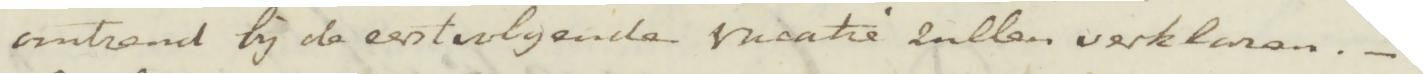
omtrend bij de eerstvolgende vacatie zullen verklaren.—
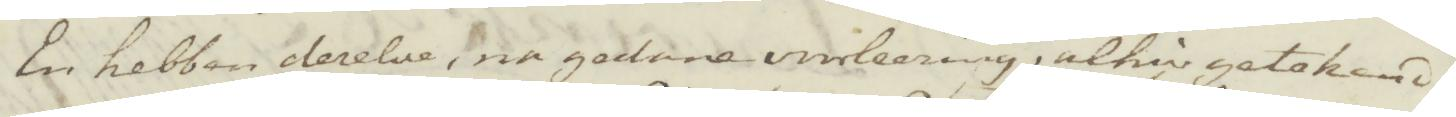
En hebben dezelve, na gedane voorleezing, alhier getekend.
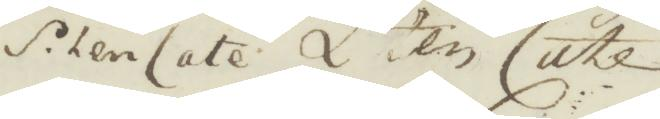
S:ten Cate L ten Cate
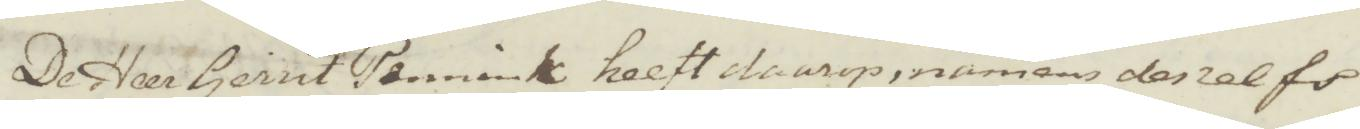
De Heer Gerrit Pennink heeft daarop, namens deszelfs
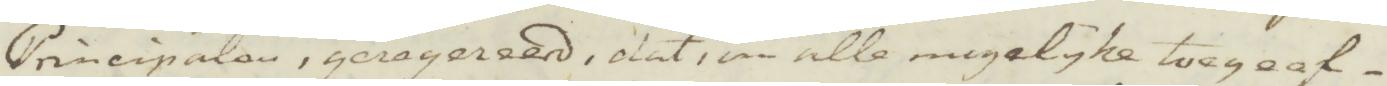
Principalen, gereagereerd, dat, om alle mogelijke toegeef-
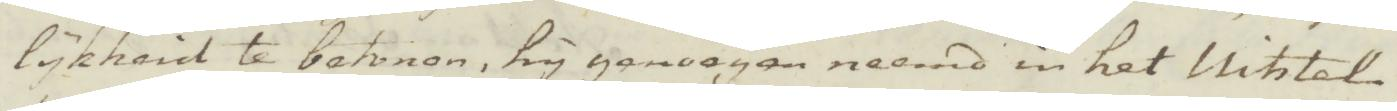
lijkheid te betonen, hij genoegen neemd in het Uitstel
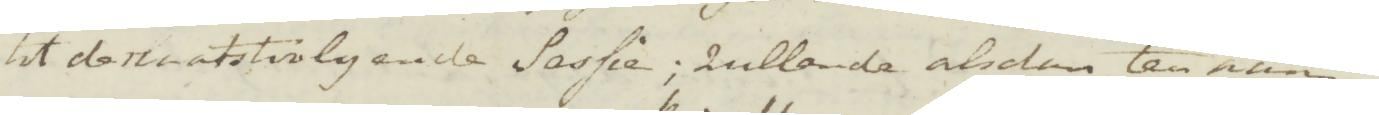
tot der naatstvolgende Sessie; zullende als dan, ten aan
